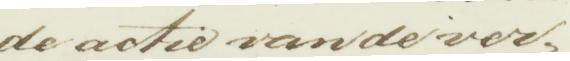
de actie van de ver,
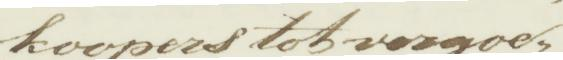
koopers tot vergoe„
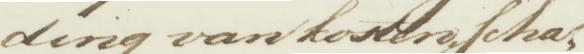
ding van kosten, scha„
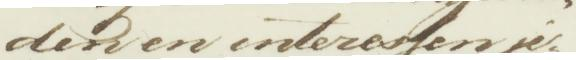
den en interessen je„
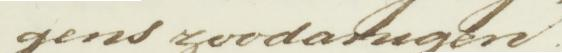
gens zoodanigen
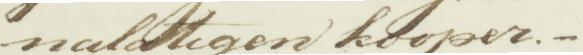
nalatigen kooper.-
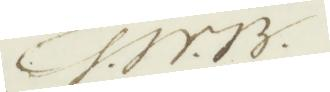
G:W:B.
